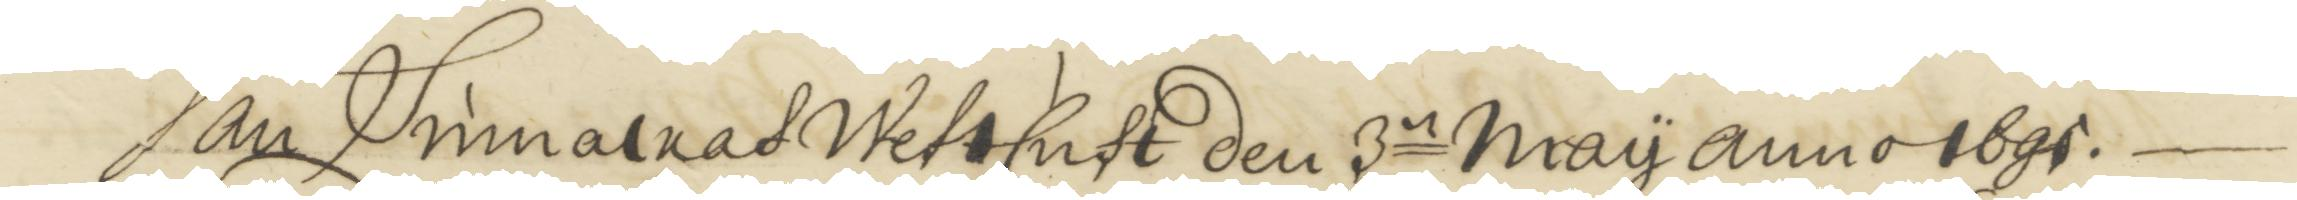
Van Sumatras West Cust den 3=n Maij anno 1695. —
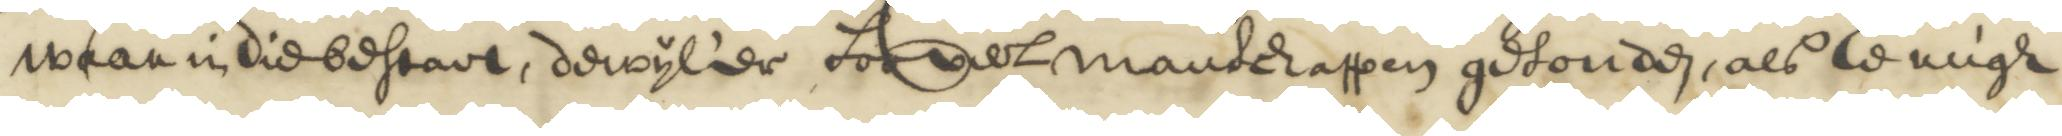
waar in die bestaet, dewijl 'er soo veel manschappen gesonden, als te rugh
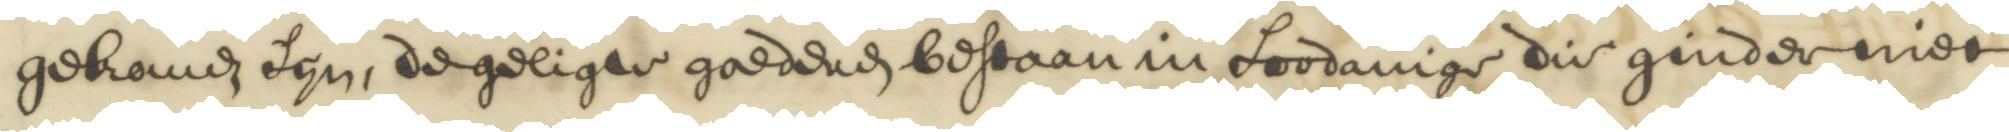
gekomen sijn, de geligte goederen bestaan in soodanige die ginder niet
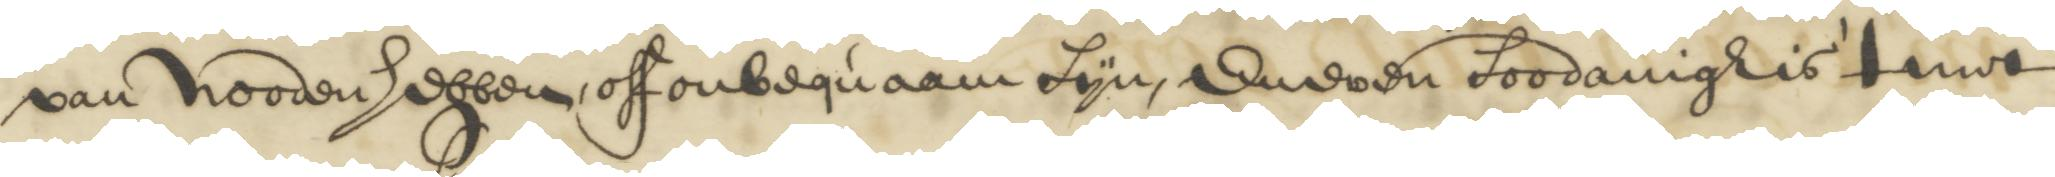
van nooden hebben, off onbequaam sijn, Eneven soodanigh is ’t met
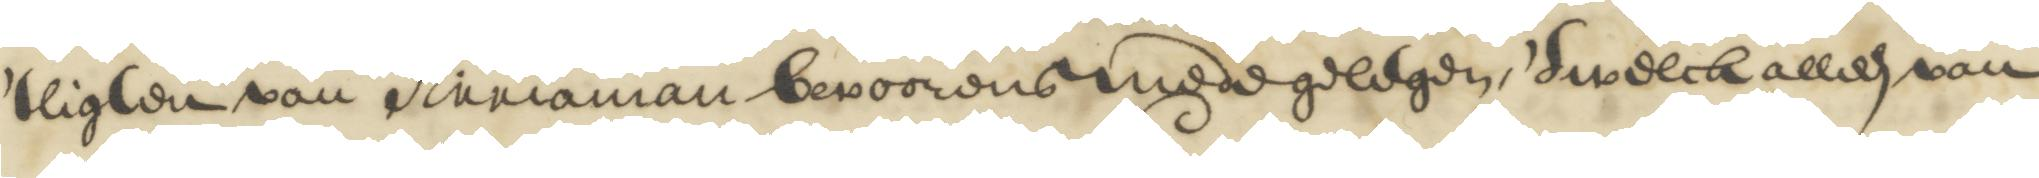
'tligten van Pirriaman bevoorens mede gelegen, 'twelck alleen van
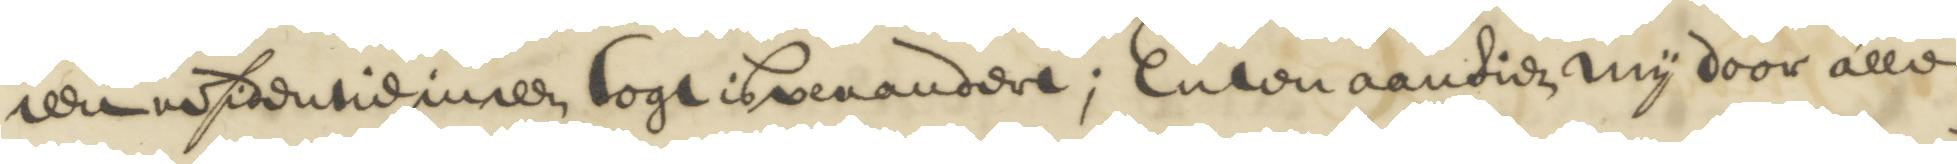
een residentie in een togt is verandert; En ten aansien mij door alle
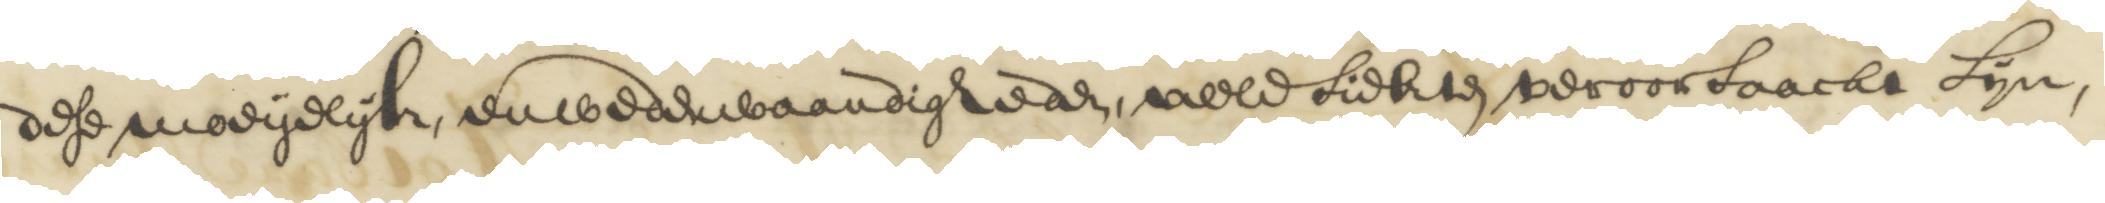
dese moeijelijk, en wederwaardigheden, veele siekten veroorsaackt sijn,
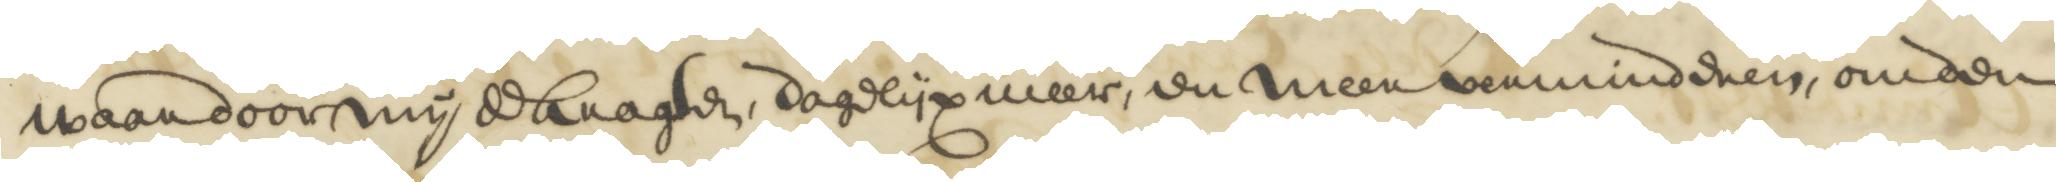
waar door mij de kragten, dagelijx meer, en meer verminderen, om den
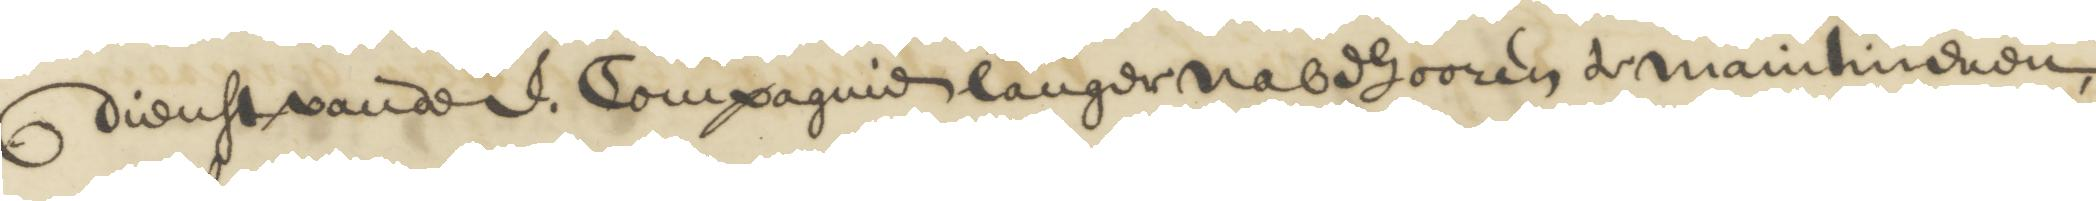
dienst van de E. Compagnie langer na behooren te maintineren,
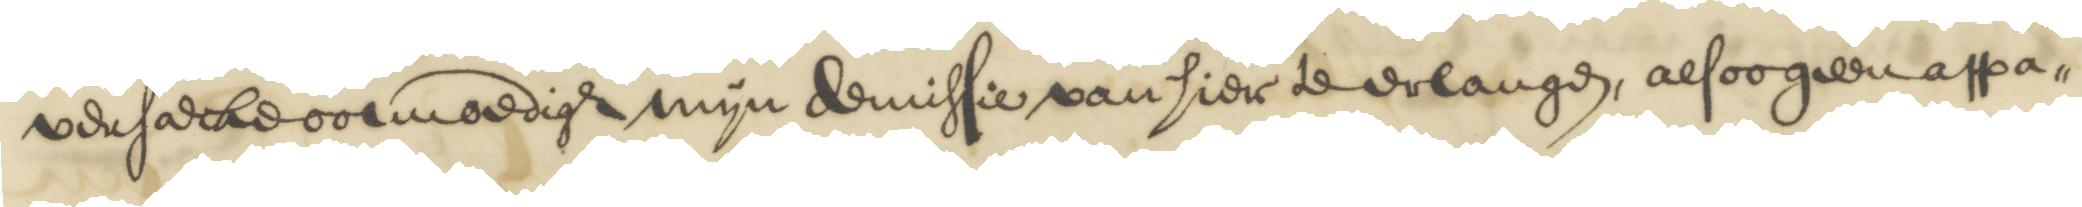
versoecke ootmoedigh mijn de missie van hier te erlangen, alsoo geen appa„
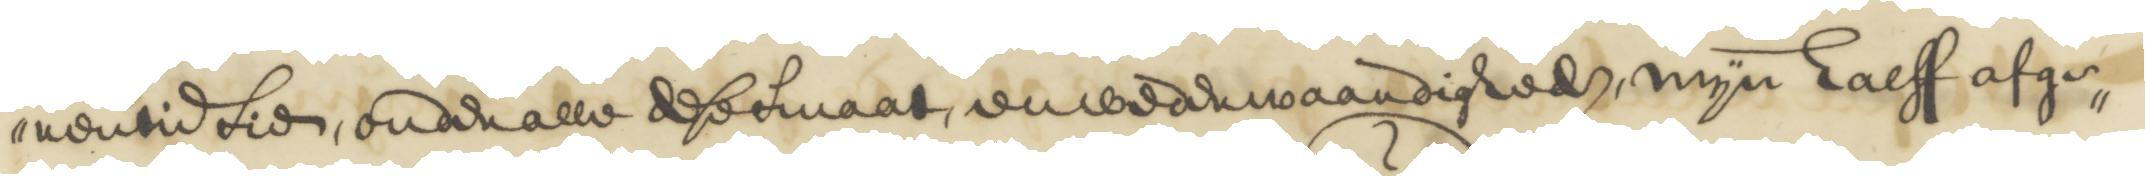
„rentie sien, onder alle dese smaat, en wederwaardigheden, mijn halff afge„
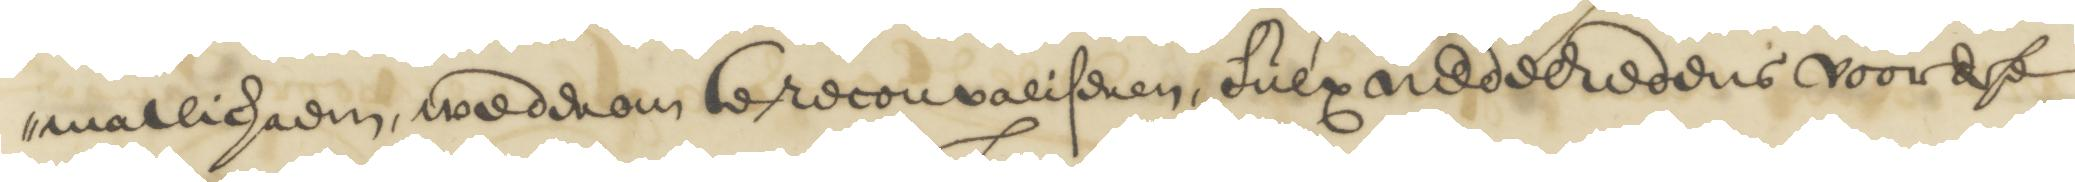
„matlichaem, wederom te reconvaliseren, sulx uEdelhedens voor dese
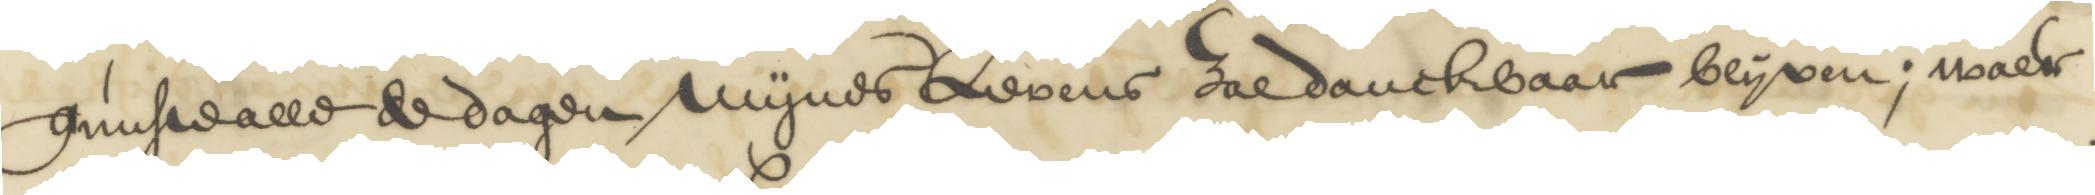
gunste alle de dagen mijnes Levens zal danckbaar blijven; waer
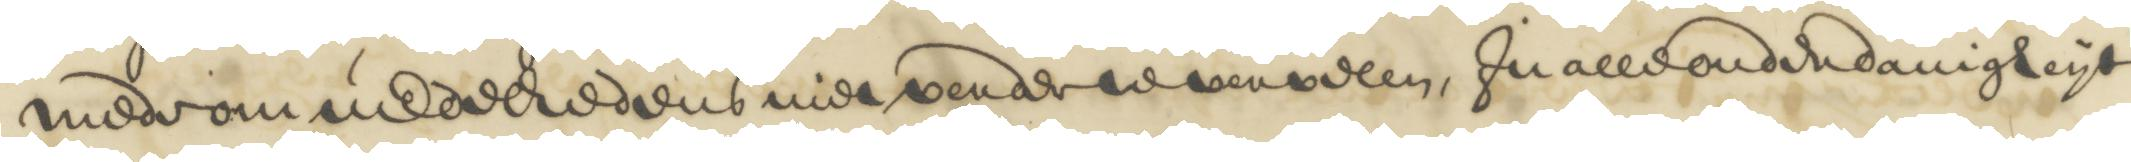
mede om uEdelhedens niet verder te vervelen, In alle onderdanigheijt
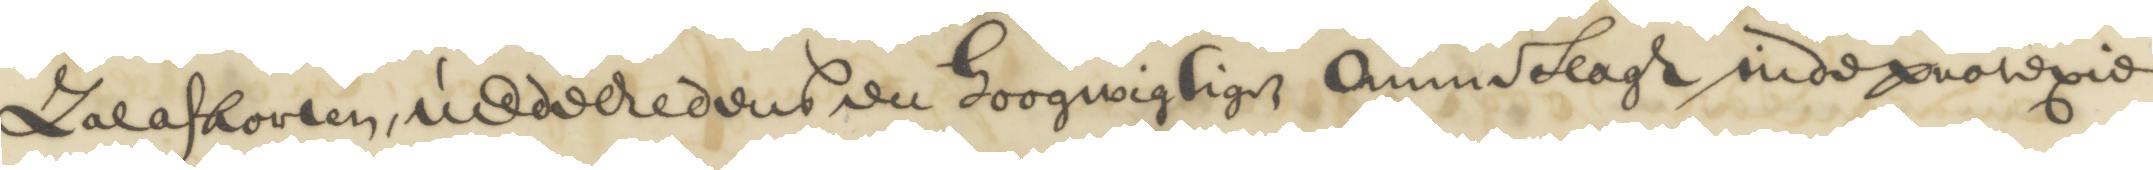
zal afkorten, uEdelhedens en hoogwigtigen Ommeslagh inde protexie
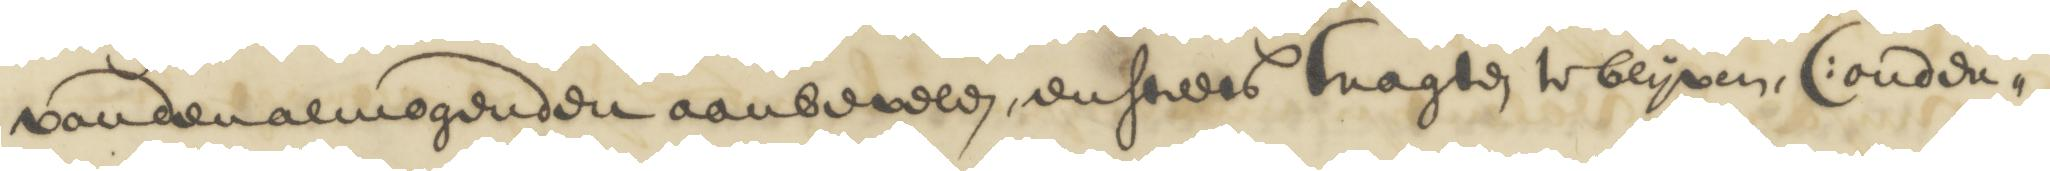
van den almogenden aanbevelen, en steets tragten te blijven, (:onder„
